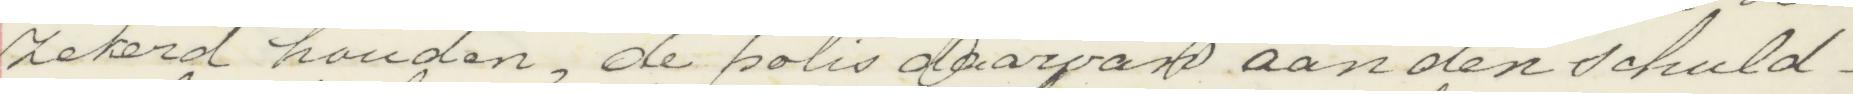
zekerd houden, de polis daarvan aan den schuld
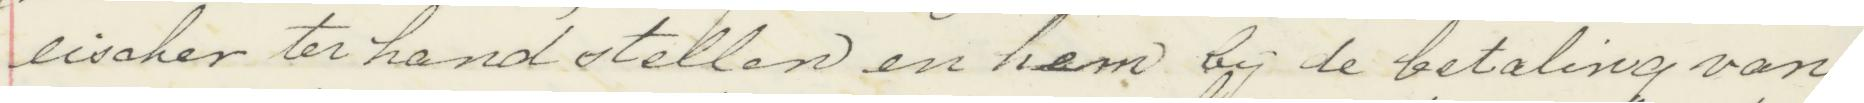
eischer ter hand stellen en hem bij de betaling van
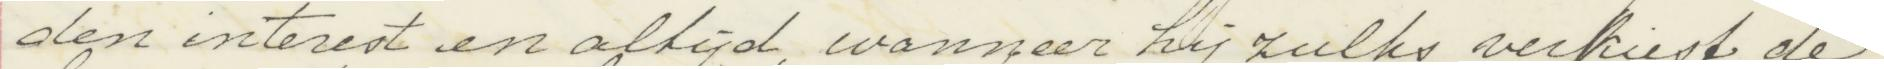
den interest en altijd wanneer hij zulks verkiest, de
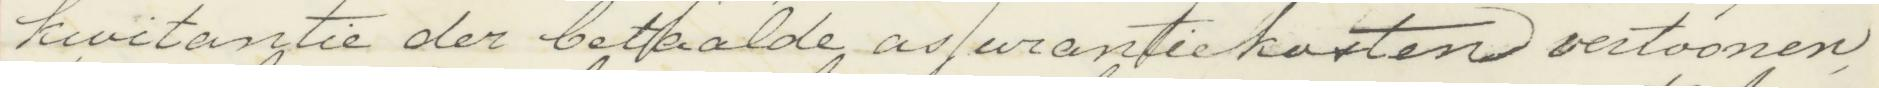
kwitantie der betaalde assurantie kosten vertoonen,
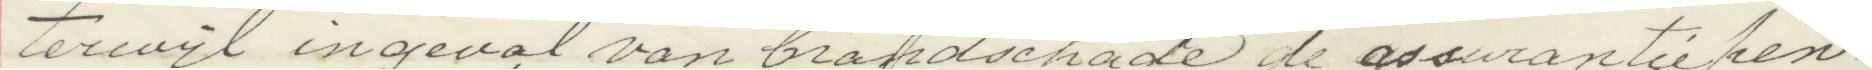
terwijl in geval van brandschade de assurantiepen-
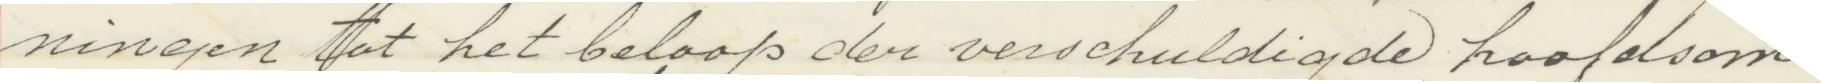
ningen tot het beloop der verschuldigde hoofdsom
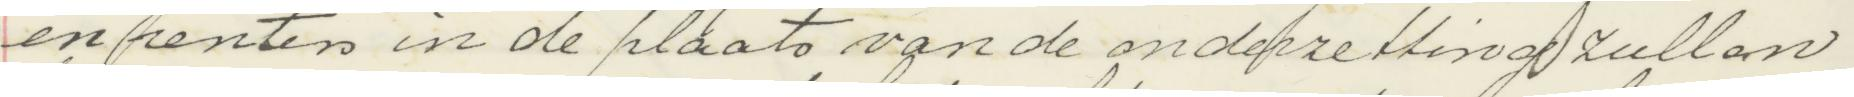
en renten in de plaats van de onderzetting zullen
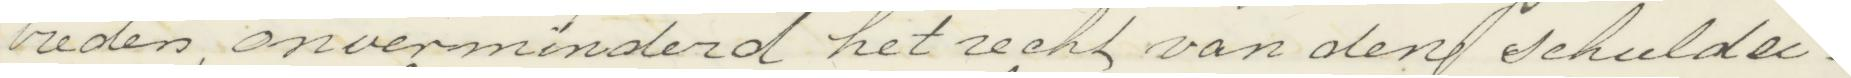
treden, onverminderd het recht van den schuldei-
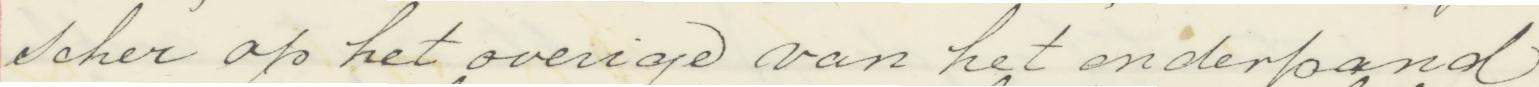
scher op het overige van het onderpand
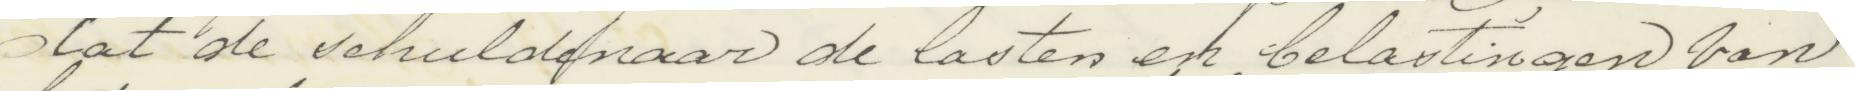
dat de schuldenaar de lasten en belastingen van
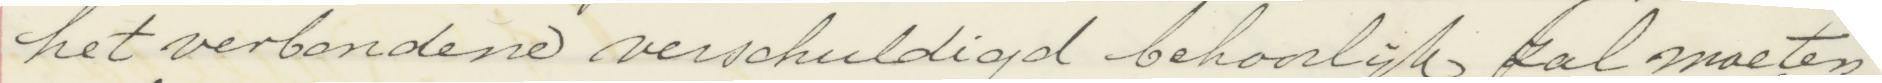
het verbondene verschuldigd behoorlijk zal moeten
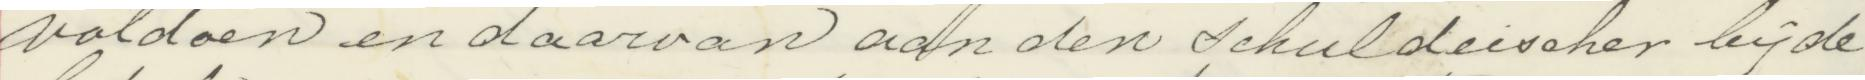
voldoen en daarvan aan den schuldeischer bij de
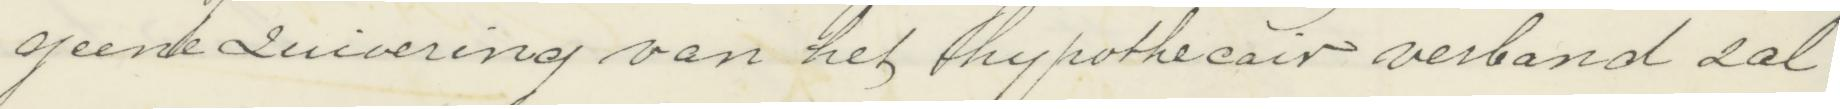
geene zuivering van het hypotheceir verband zal
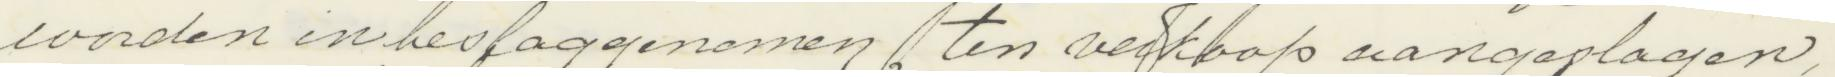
worden in beslaggenomen ten verkoop aangeslagen,
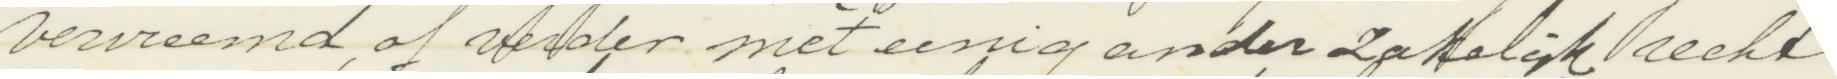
vervreemd of verder met eenig ander zakelijk recht
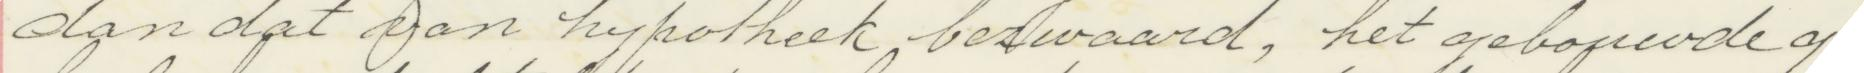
dan dat van hypotheek bezwaard, het gebouwde ge
